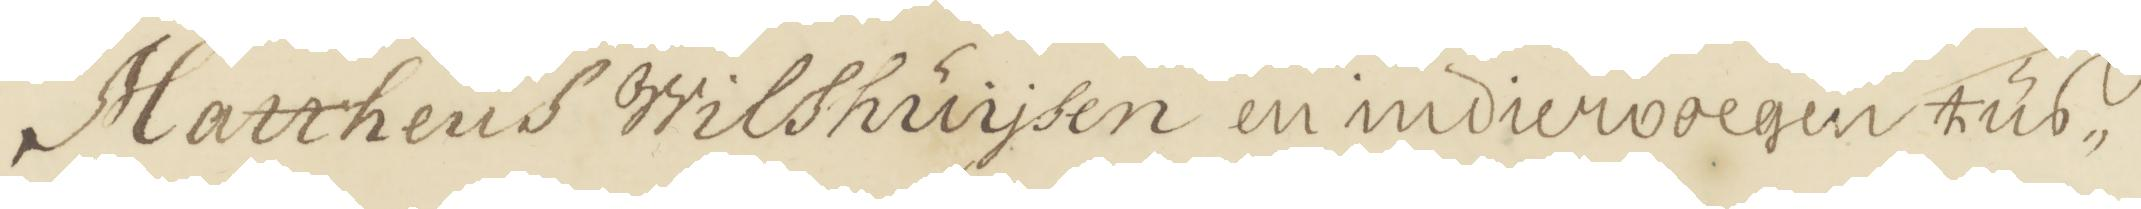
Mattheus Wilshuijsen en indiervoegen tus„
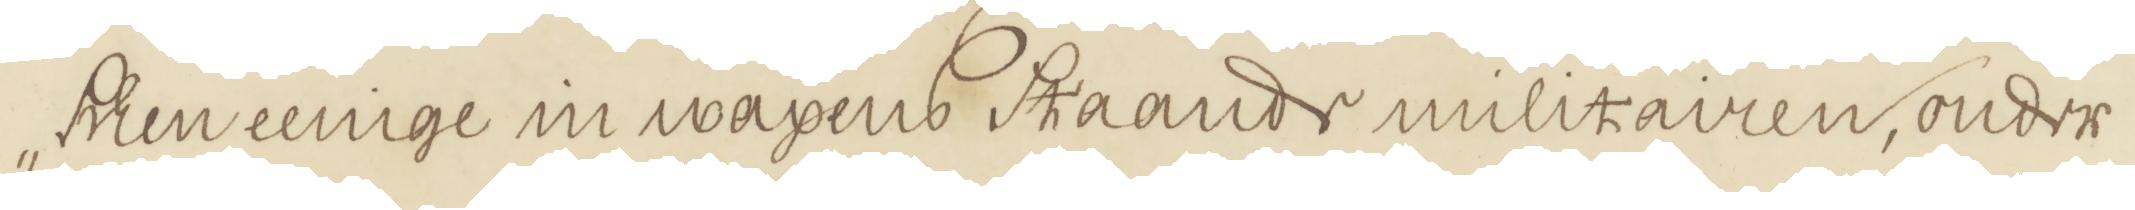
„schen eenige in wapens staande militairen, onder
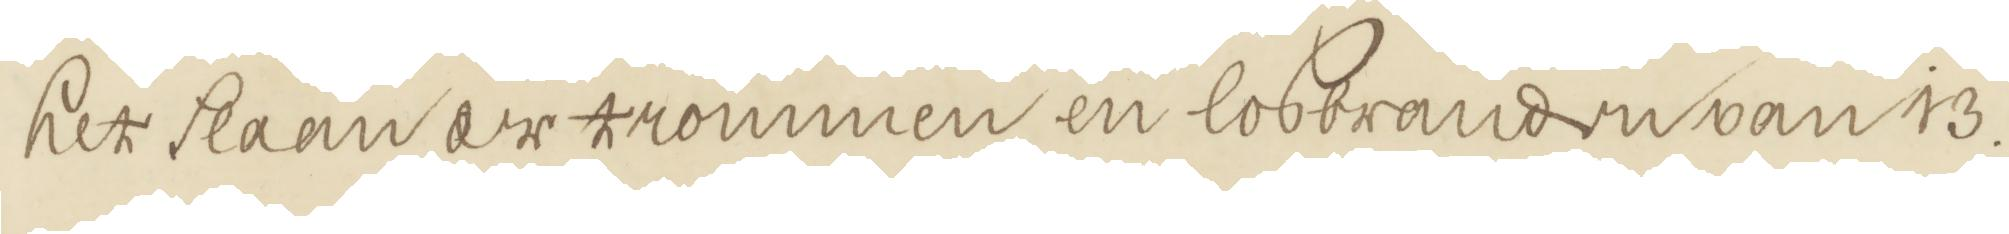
het slaan der trommen en losbranden van 13.
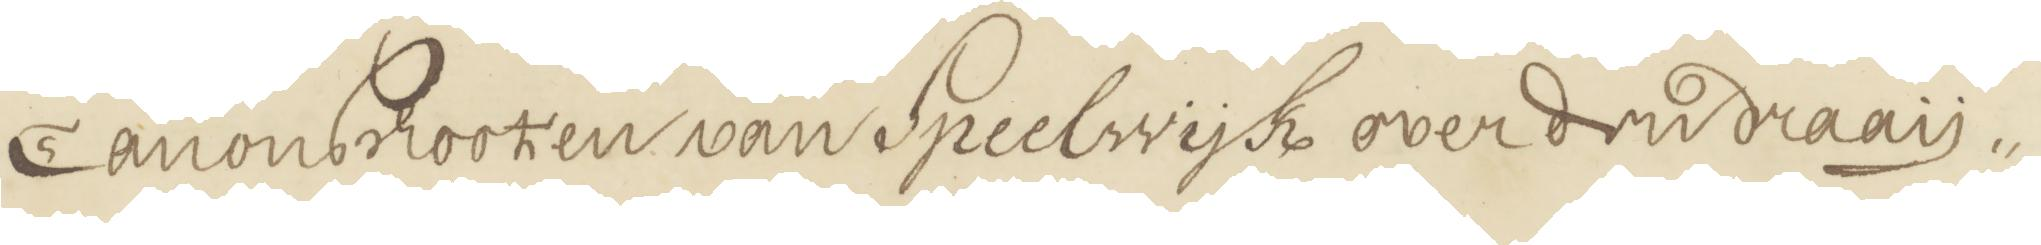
canonschooten van Speelwijk over den draaij „
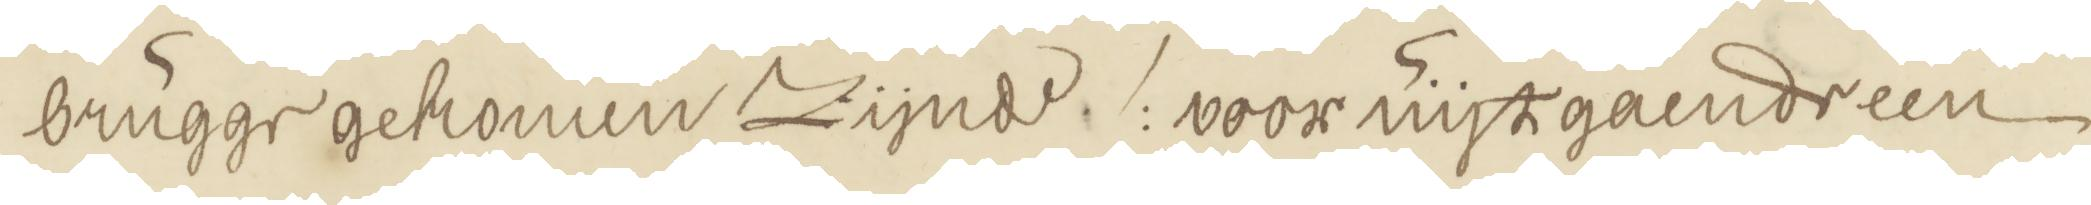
brugge gekomen zijnde /:voor uijt gaende een
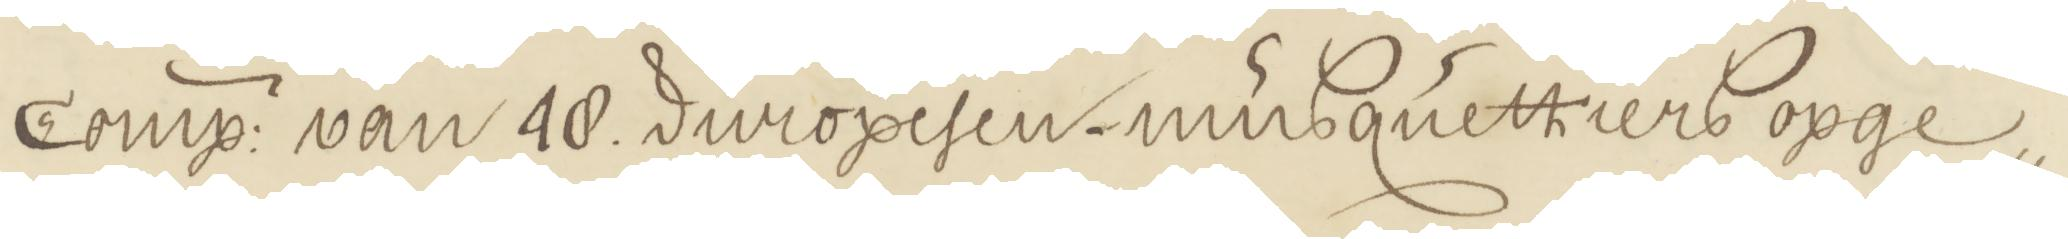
comp: van 48. Europesen-musquettiers opge„
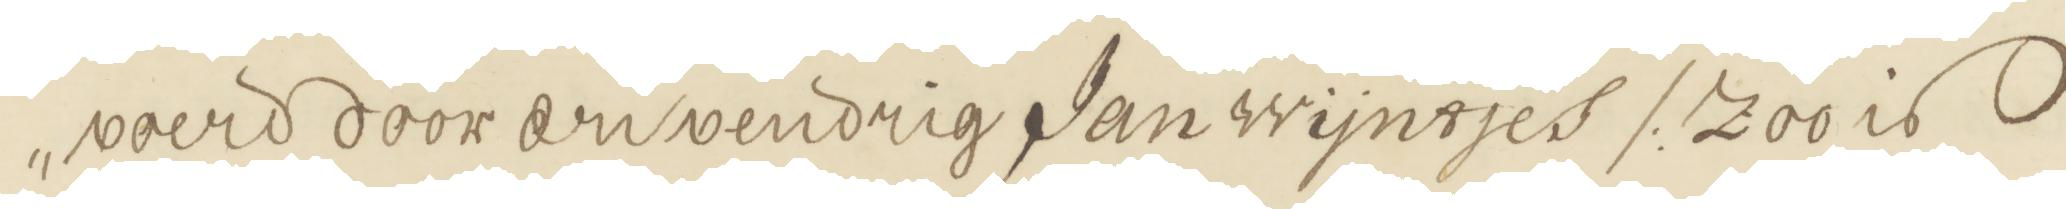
„voerd door den vendrig, Ian Wijntjes /:zoo is
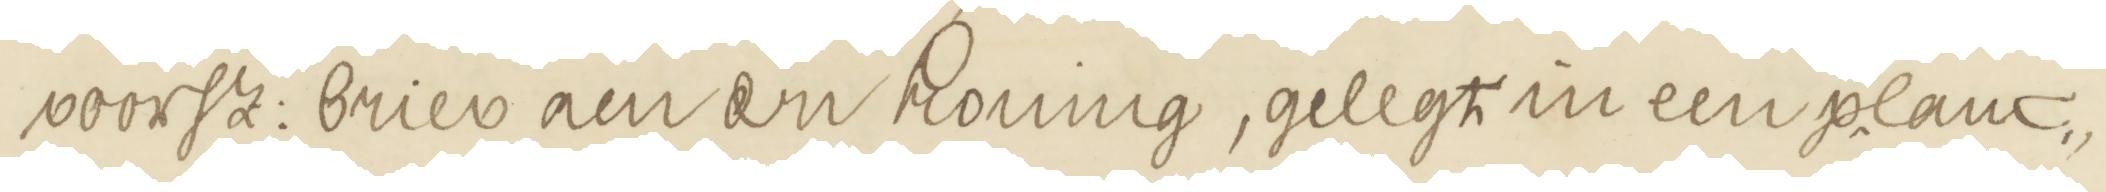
voorsz: briev aen den koning, gelegt in een palanc„
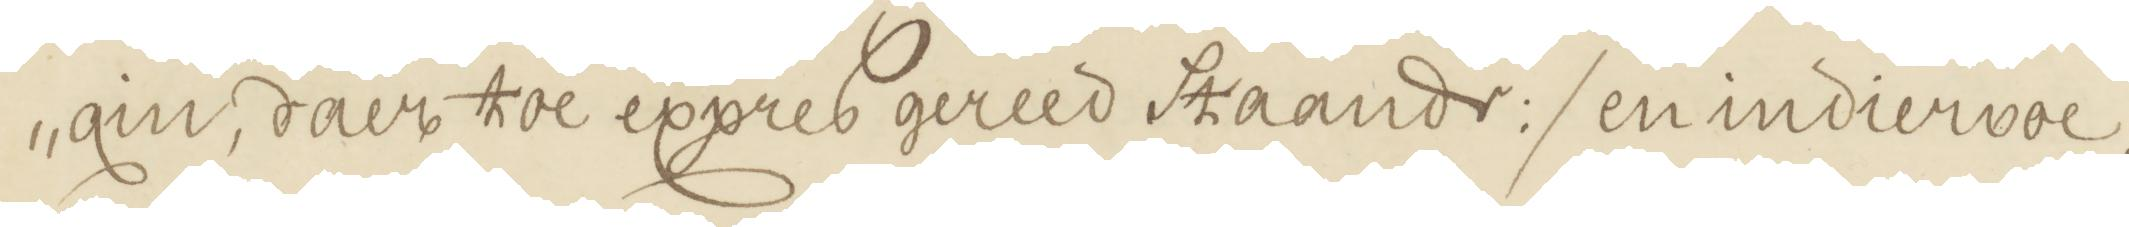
„qin, daer toe expres gereedstaande:/ en indiervoe
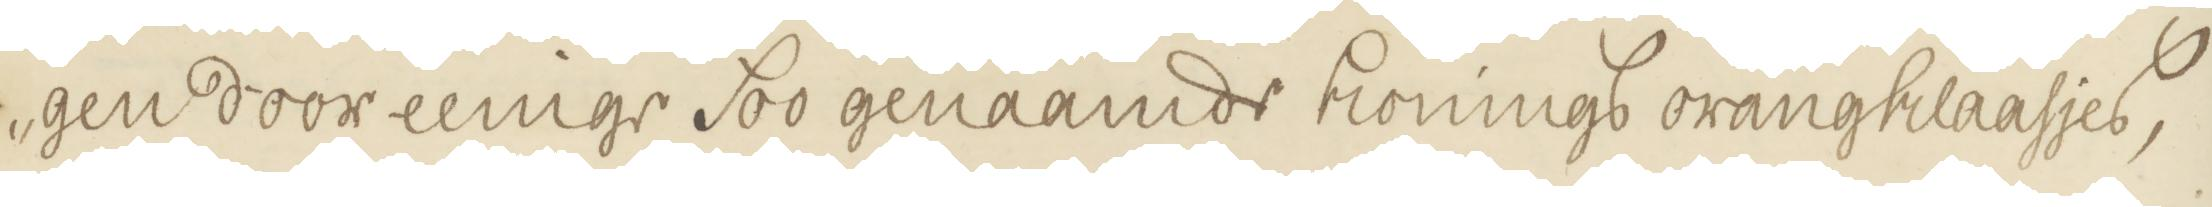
„gen door eenigs soo genaamde konings orangklaasjes,
